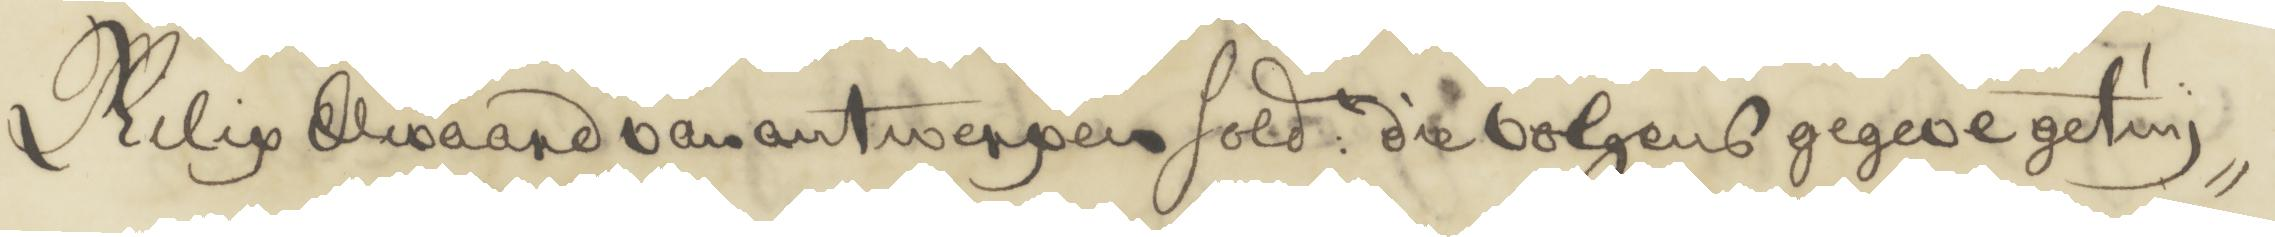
Philip de waard van antwerpen sold:t die volgens gegeve getuij„
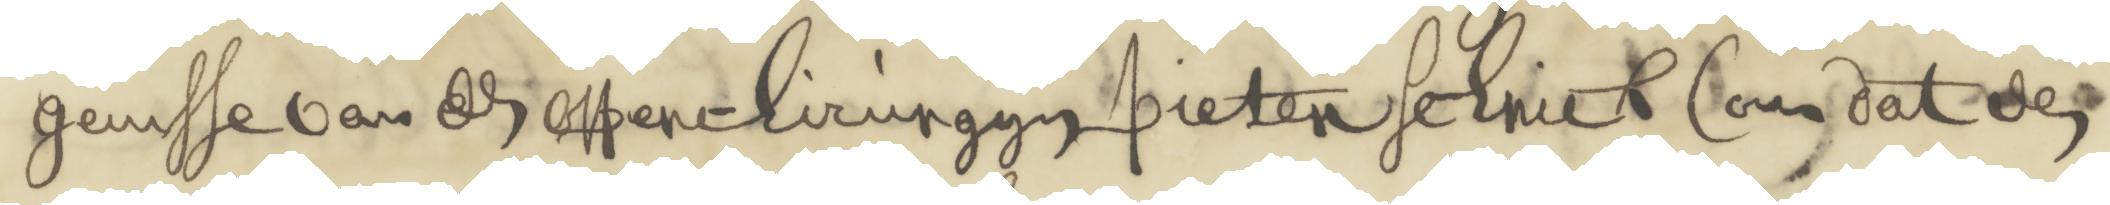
genisse van den opperchirurgijn pieter schrick (om dat een
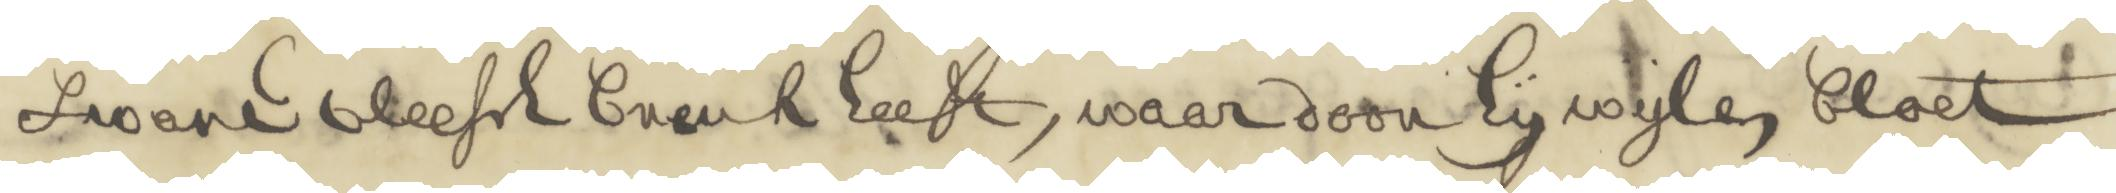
sware vleesch breuk heeft, waar door hij wijlen bloet
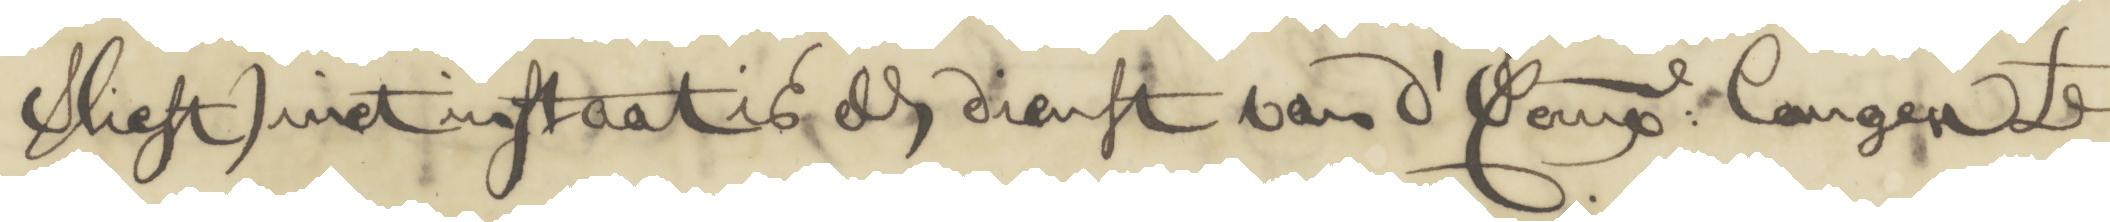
verliest) niet in staat is den dienst van d’ Comp:e langer te
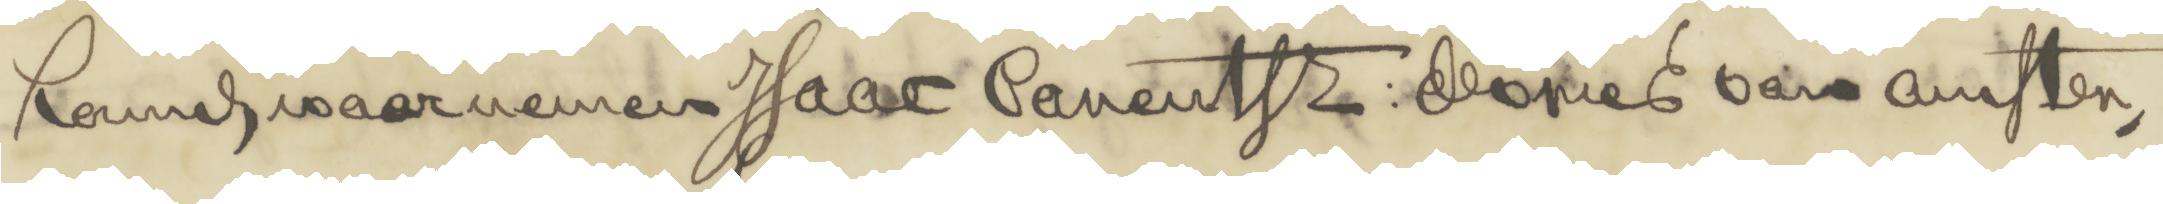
konnen waar nemen Isaac barentsz: de vries van amster„
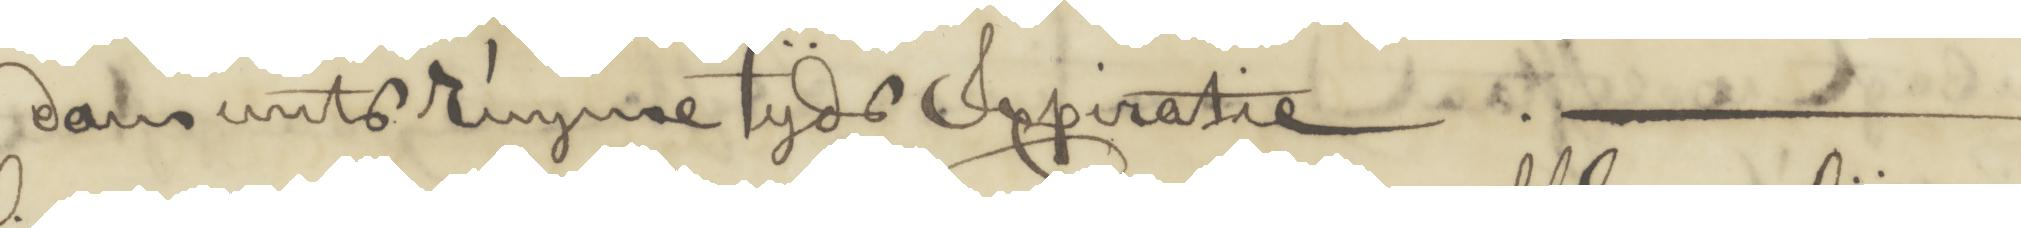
dam mits Ruijme tijds Expiratie. —
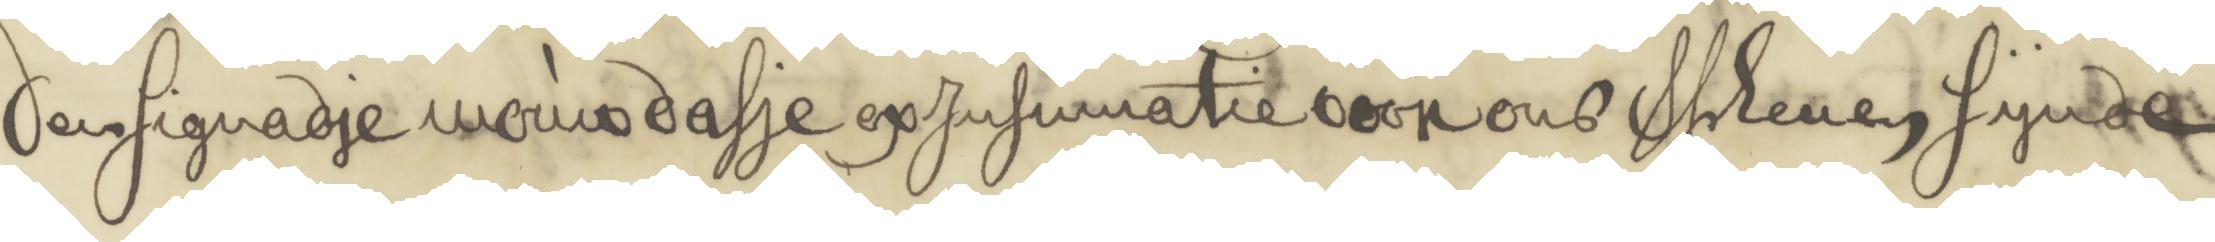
den signadje mouw dasje op Insumatie voor ons verschenen sijnde
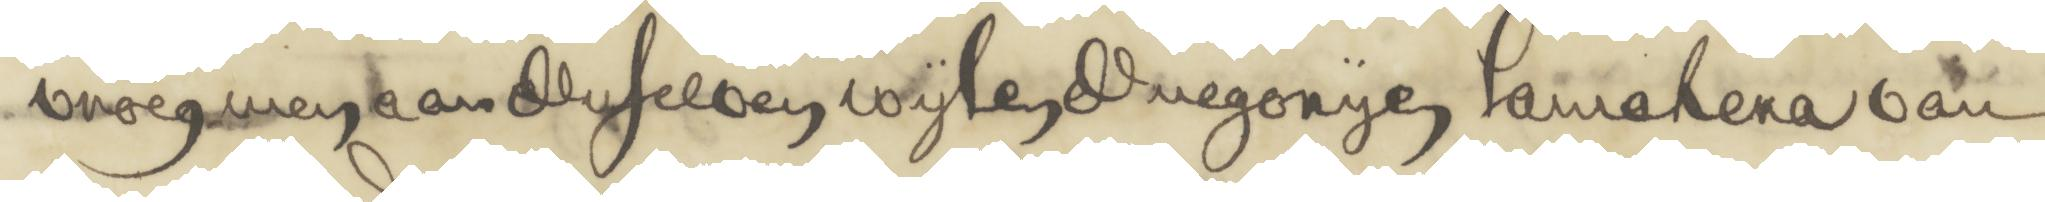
vroeg men aan denselven wijlen de negorijen lamakera van
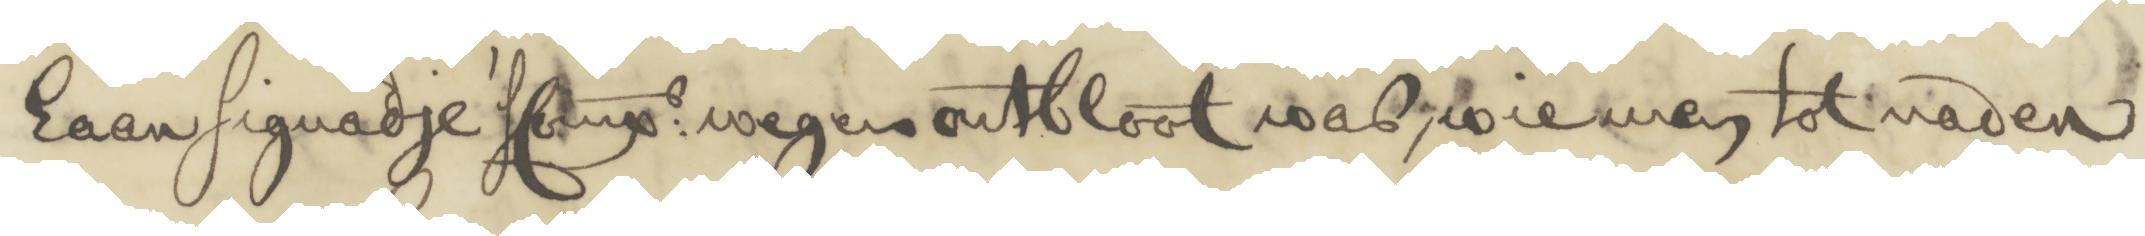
haar signadje 'sComp:s wegen ontbloot was, wie men tot nader
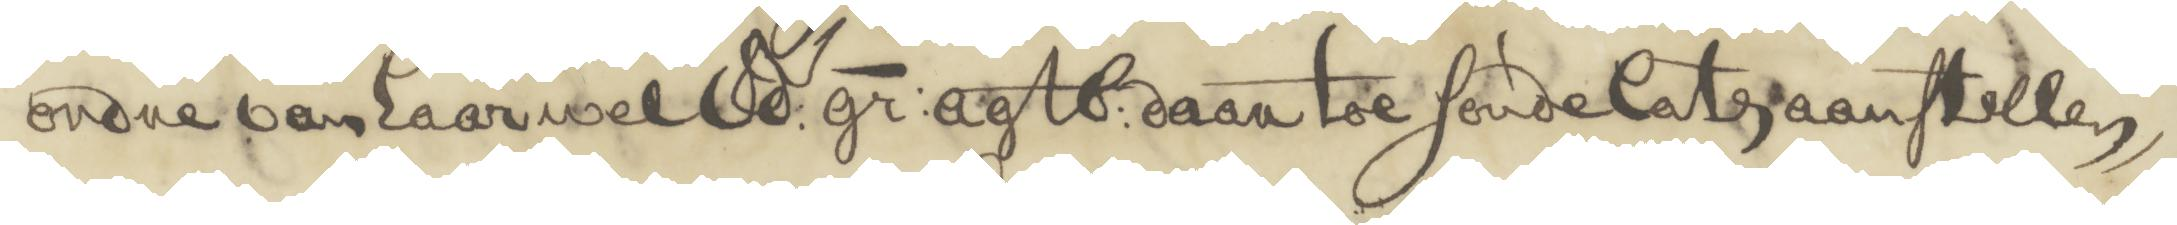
ordre van haar wel Ed: gr: agtb: daar toe soude laten aan stellen,
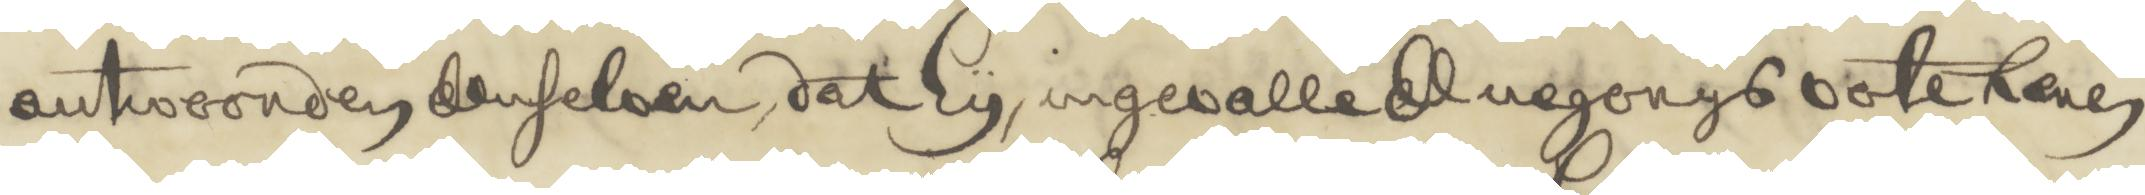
antwoorden denselven, dat hij, in gevalle de negorijs volckeren
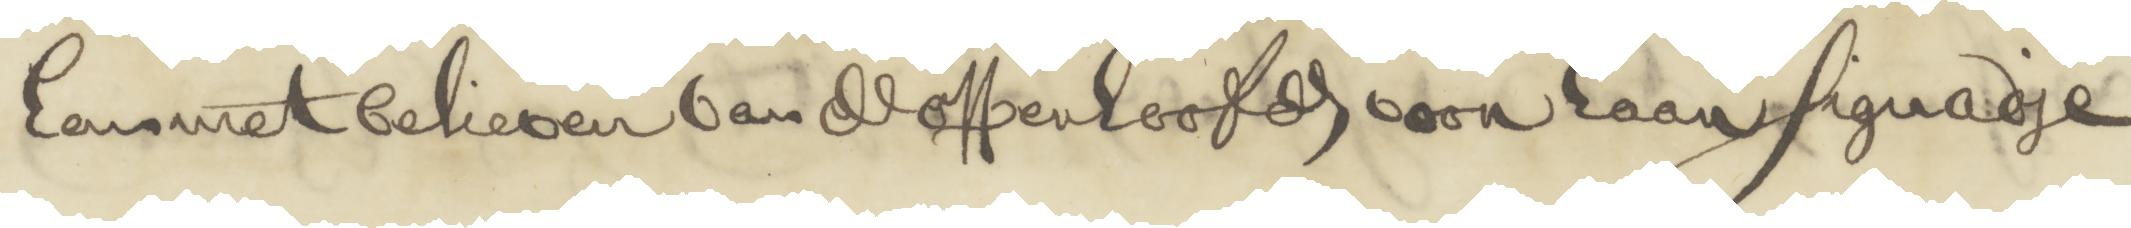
hem met believen van de opperhoofden voor haar signadje
